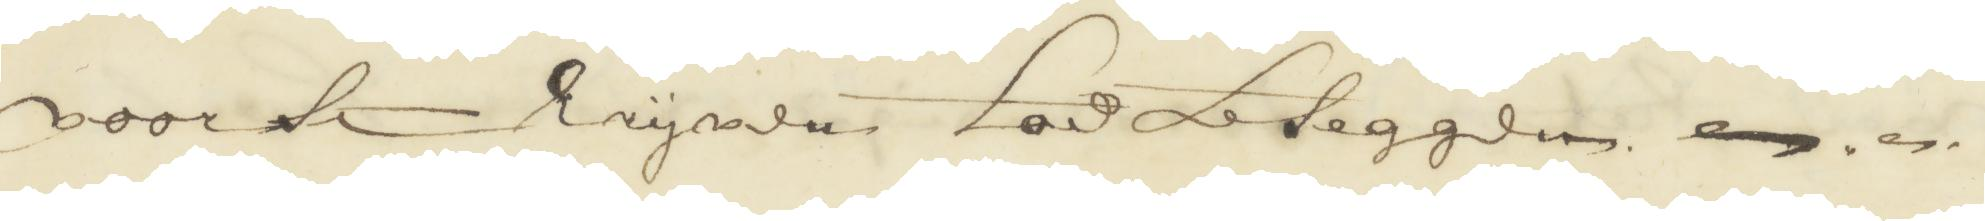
voor schrijven toe teseggen. —. —.
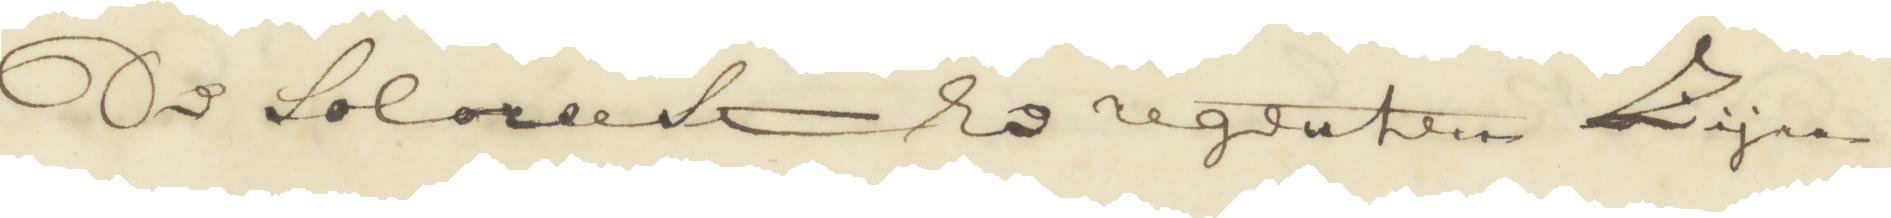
de soloreesche regenten zijn
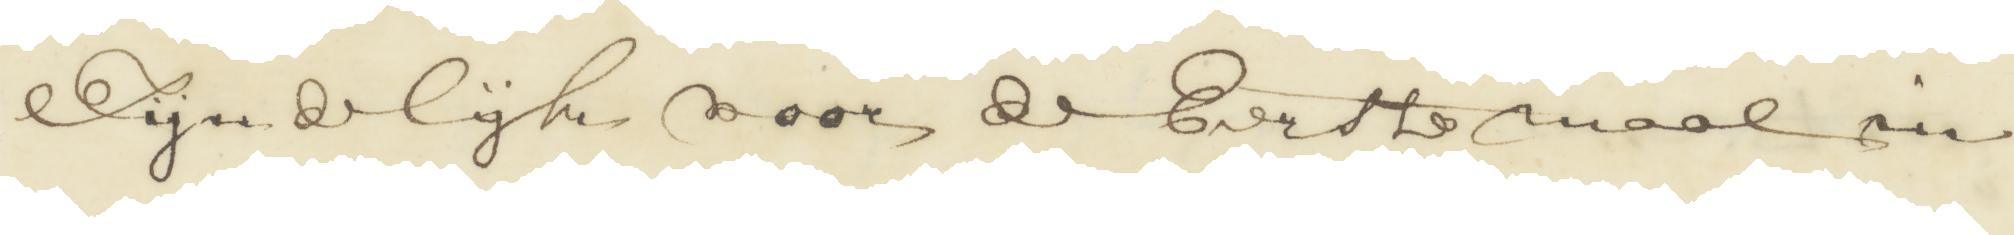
eijndelijk voor de Eerste maal in
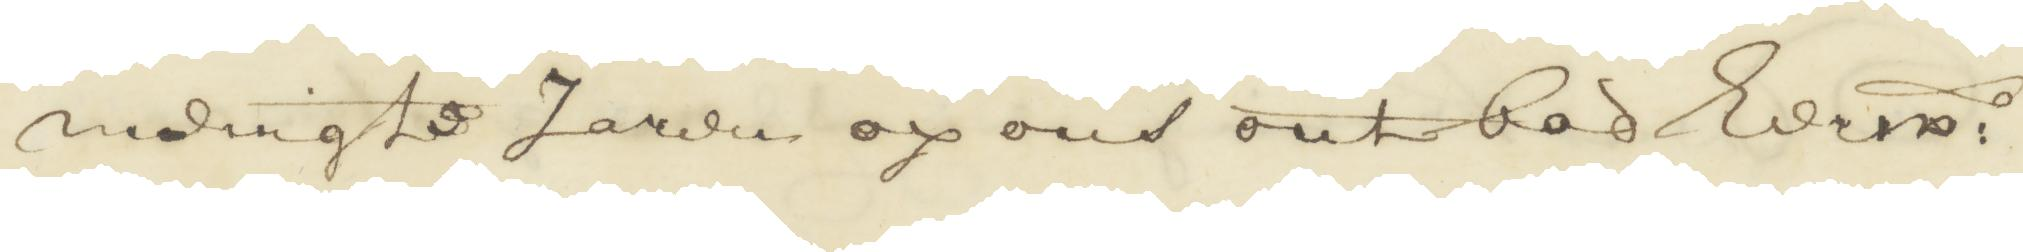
menigte Jaren op ons ontbod herw:
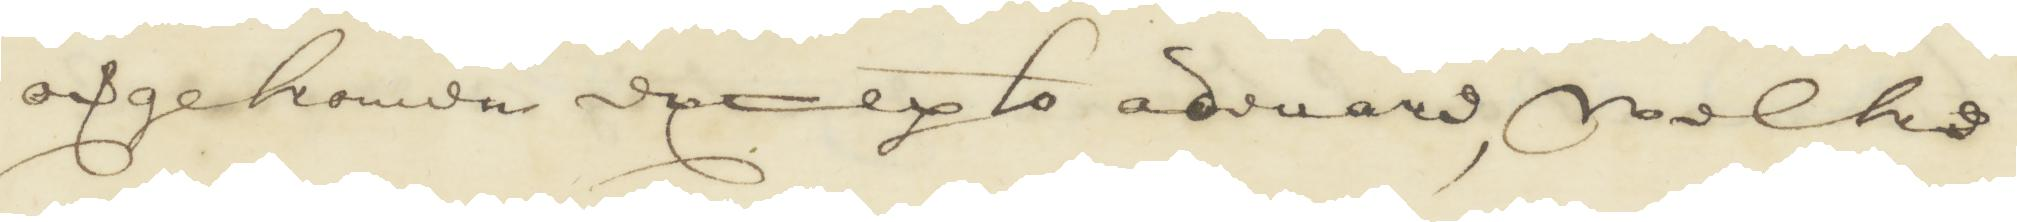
overgekomen excepto adenare, welke
